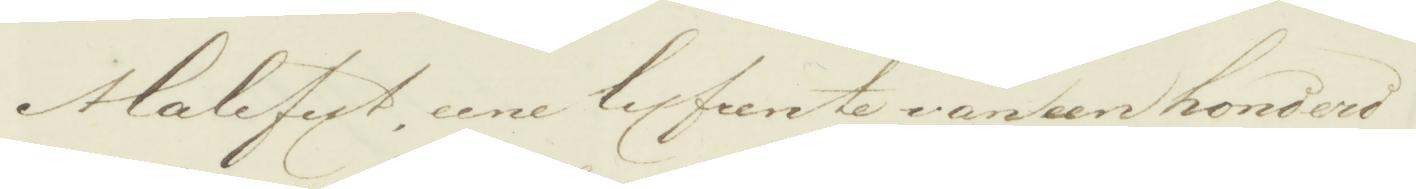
Malefyt, eene lyfrente van een honderd
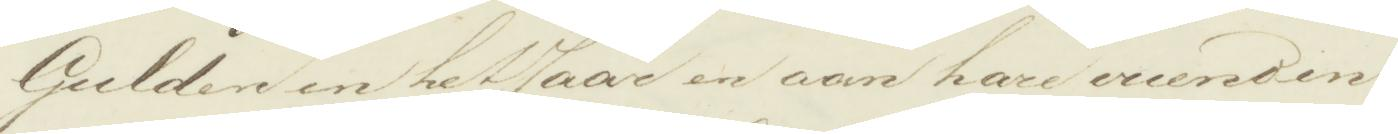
Gulden in het Jaar en aan hare vriendin
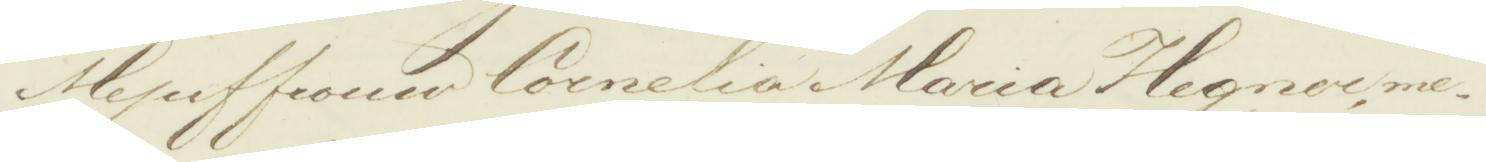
Mejuffrouw Cornelia Maria Hegner, me„
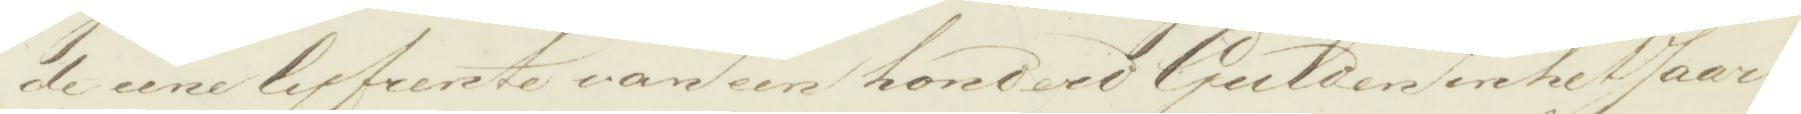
de eene lyfrente van een honderd Gulden in het Jaar,
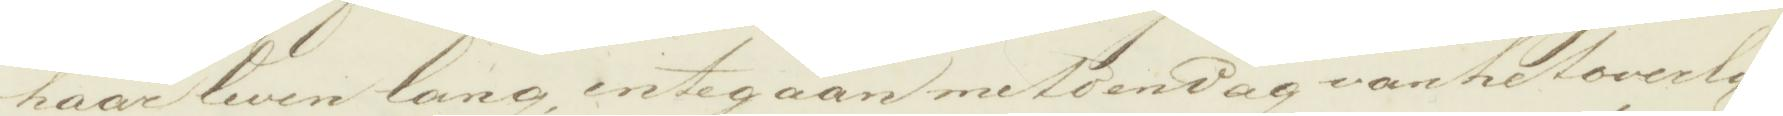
haar leven lang, in te gaan met den dag van het overly
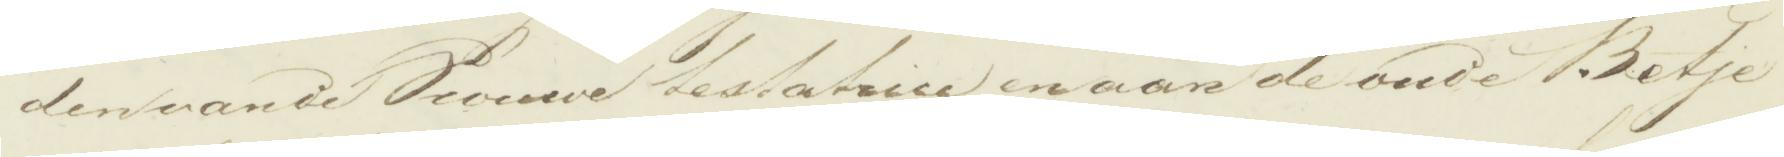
den van de Vrouwe testatrice en aan de oude Betje
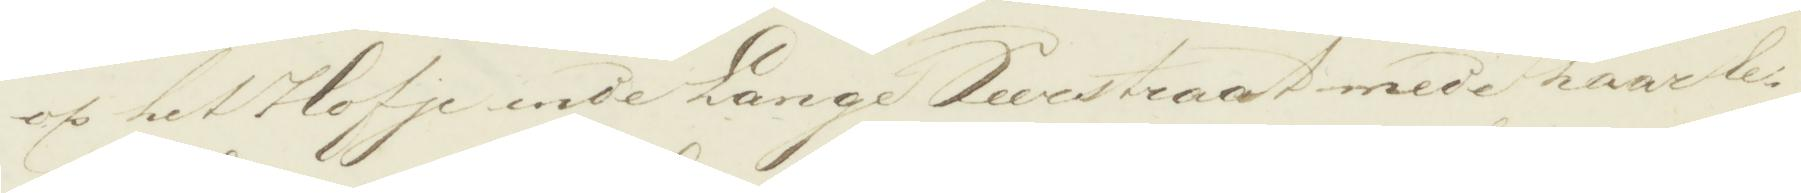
op het Hofje in de Lange Veerstraat mede haar le„
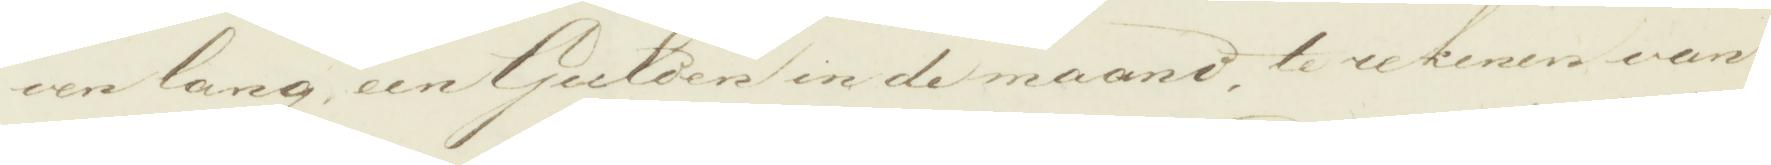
ven lang, een Gulden in de maand, te rekenen van
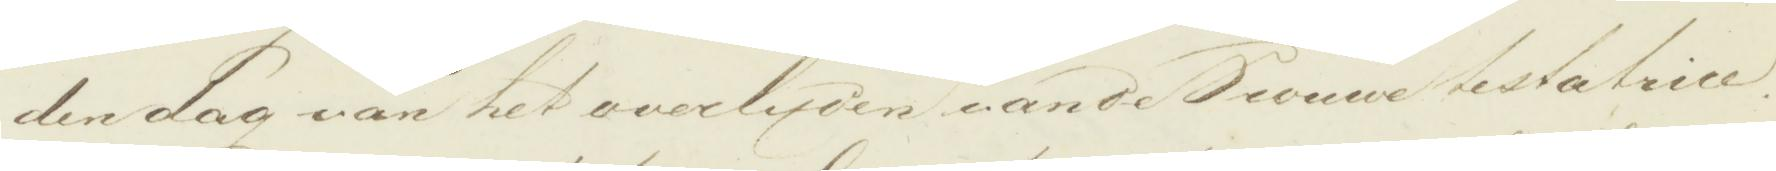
den dag van het overlyden, van de Vrouwe testatrice,
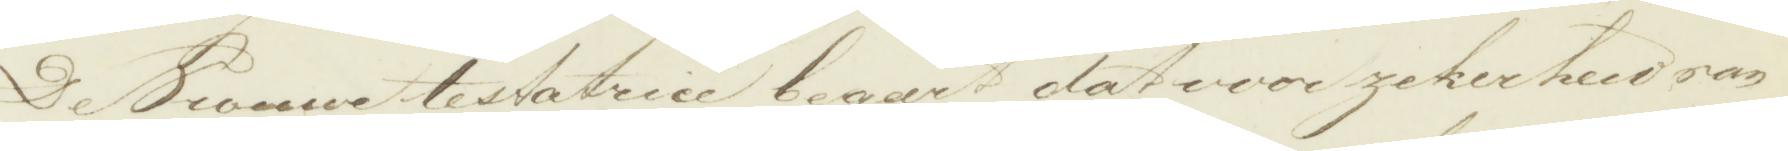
De Vrouwe testatrice begeert dat voor zekerheid van
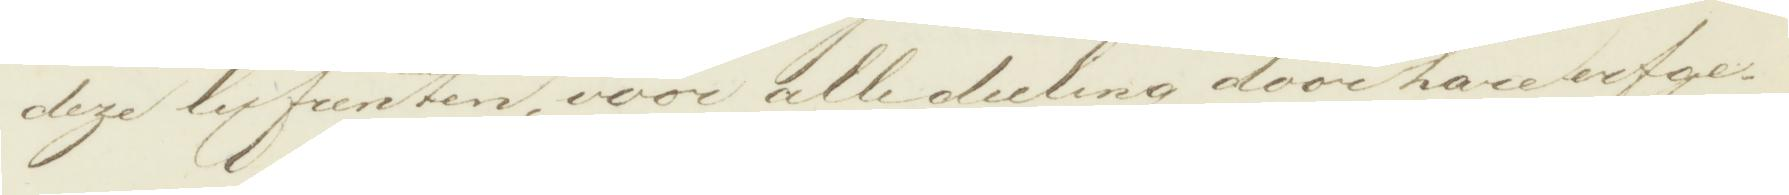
deze lyfrenten, vóór alle deeling door hare erfge„
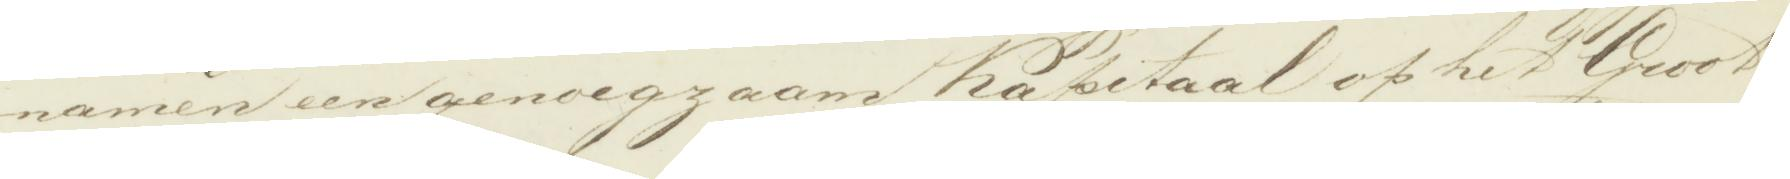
namen een genoegzaam Kapitaal op het Groot
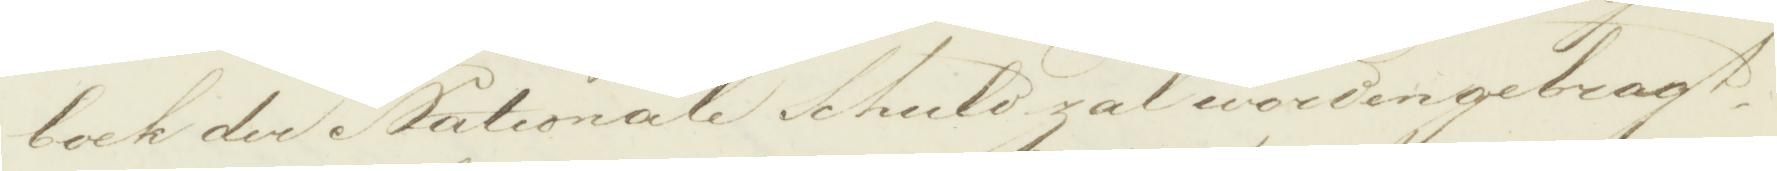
boek der Nationale Schuld, zal worden gebragt,
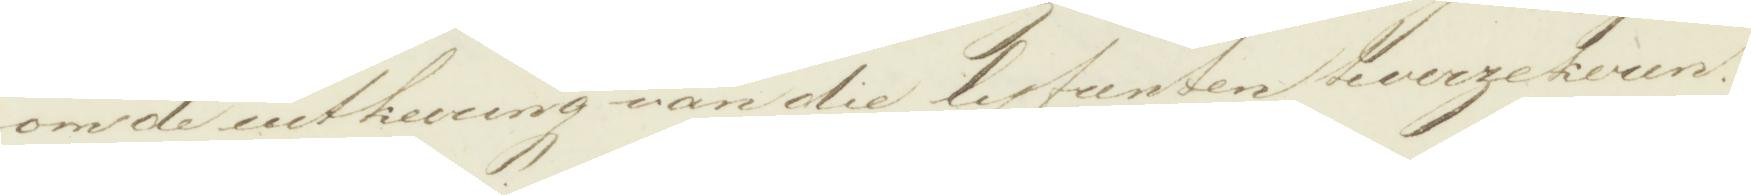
om de uitkeering van die lyfrenten te verzekeren.
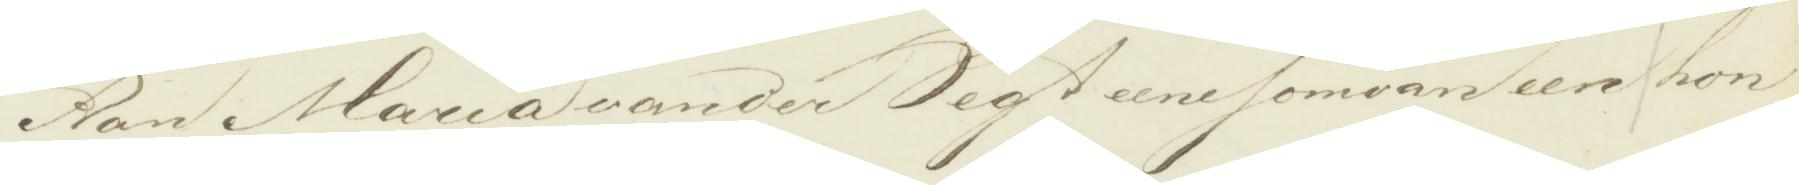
Aan Maria vander Vegt eene som van een/ hon
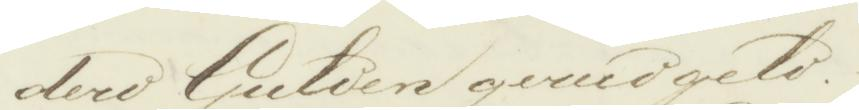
derd Gulden gereed geld.
